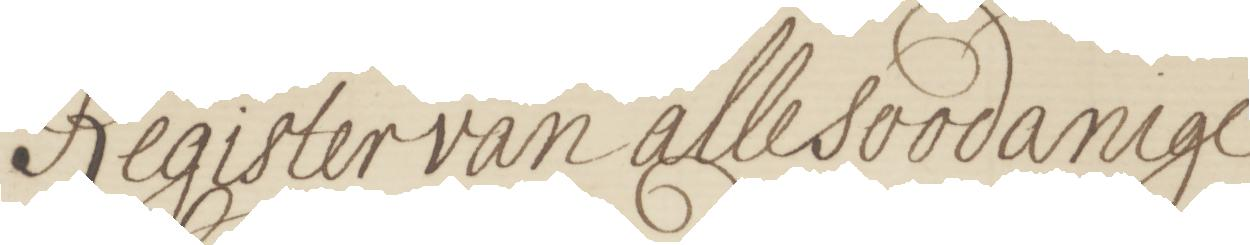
Register van allesoodanige
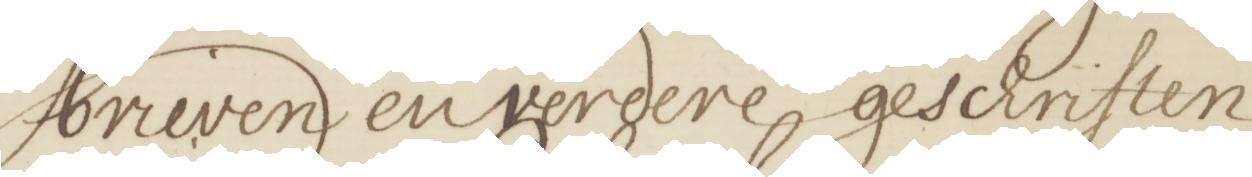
brieven en verdere geschriften
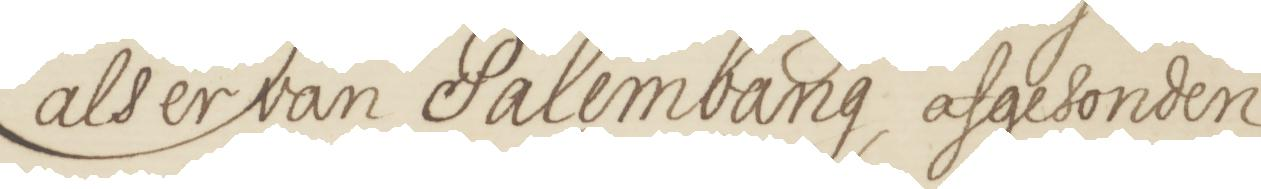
als er van Palembang afgesonden
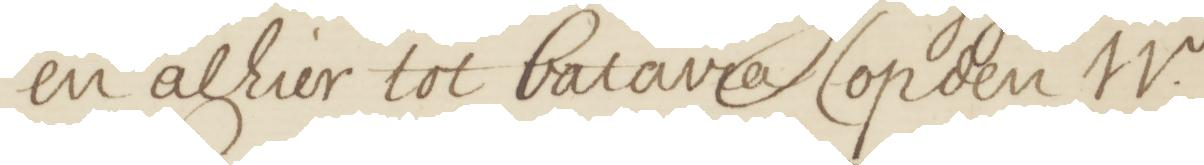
en alhier tot batavia (op den 11:e
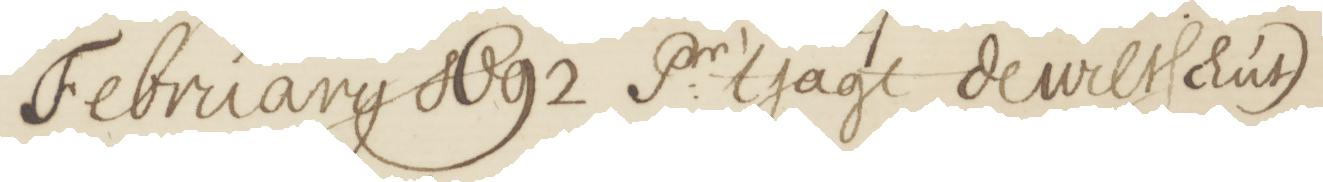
February 1692 P:r 't jagt de wiltschut)
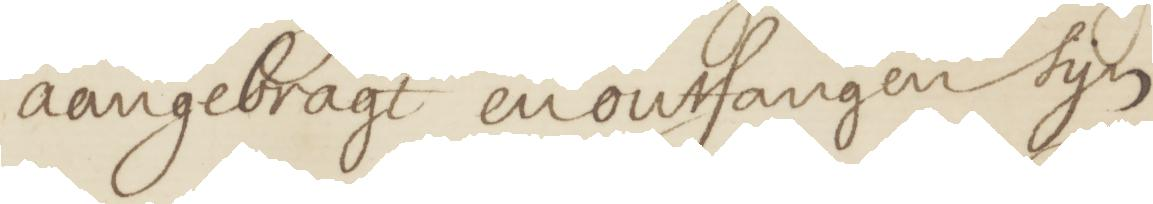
aangebragt en ontfangen sijn
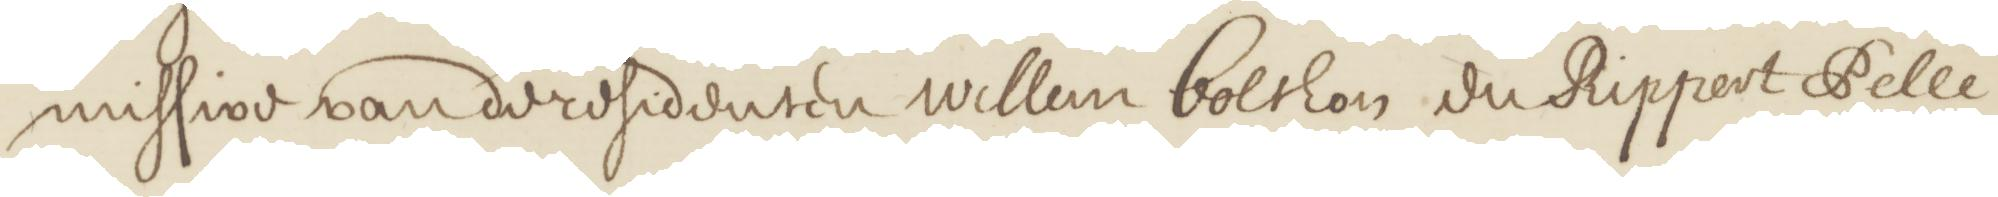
missive van de residenten willem bolthon en Rippert Pelle
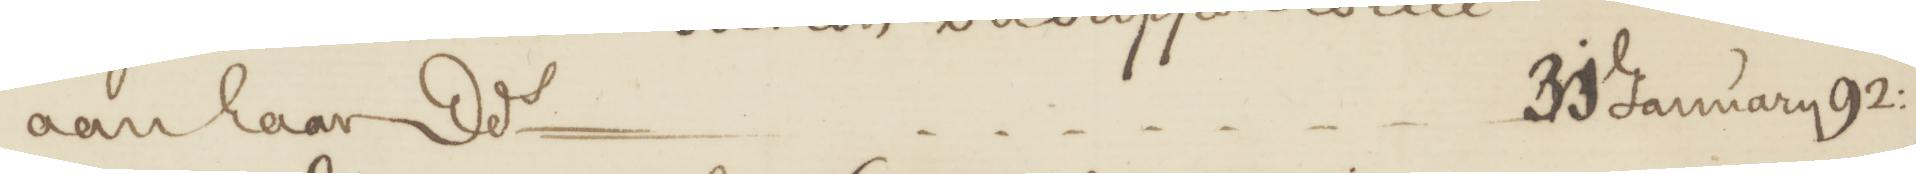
aan haar Ed=s . . . . . . . 31 Januarij 92:
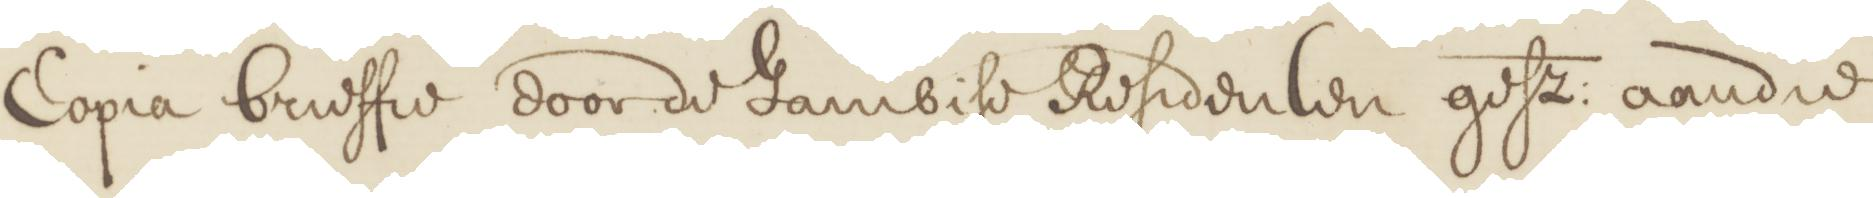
Copia brieffie door de Jambise Residenten gesz: aan die
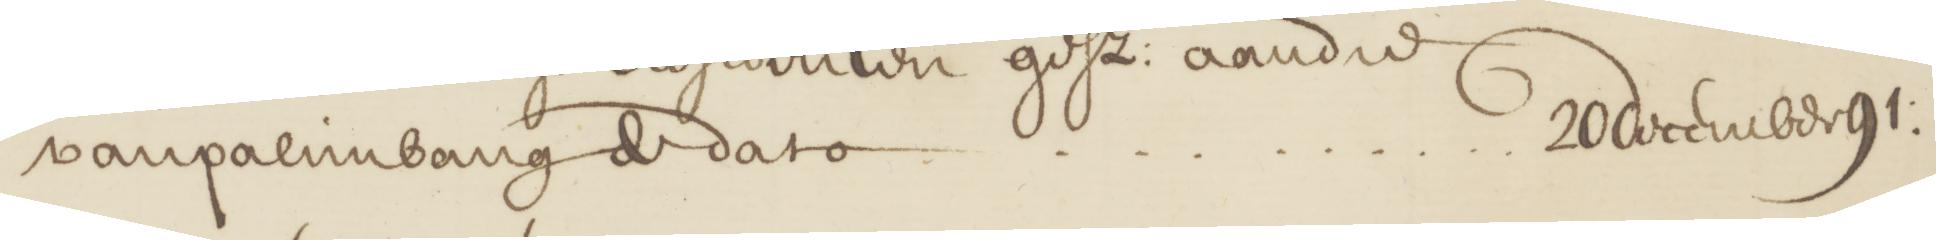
van palimbang de dato . . . . . . . . . 20 december 91:
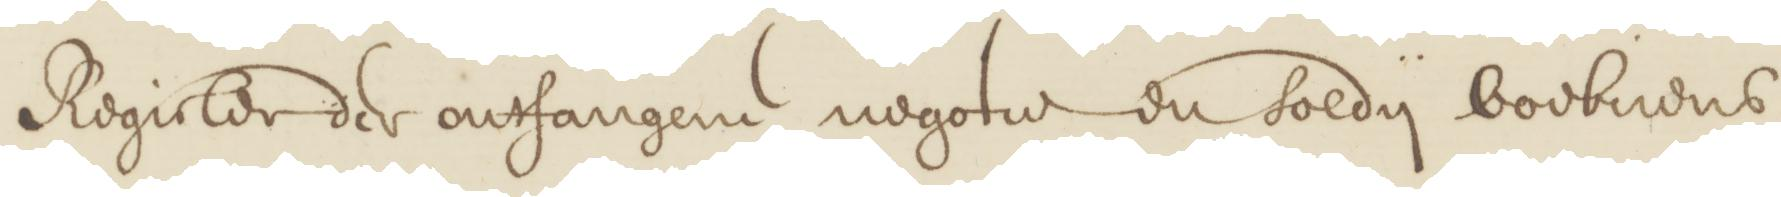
Register der ontfangene negotie en soldij boekiens
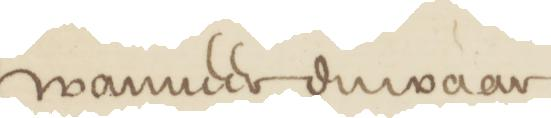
wanneer en waar
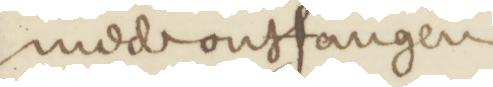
mede ontfangen
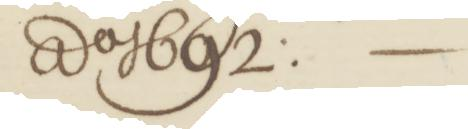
ao 1692: —
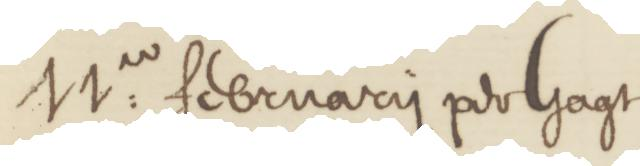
11:en februarij per tjagt
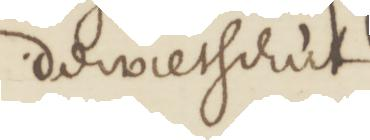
dewiltschut
